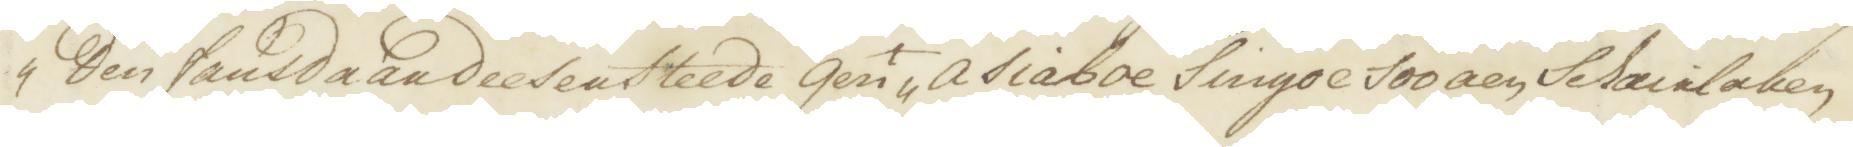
„ den faus daar deeser steede gen„t asiaboe singoe soo aen schairlaken
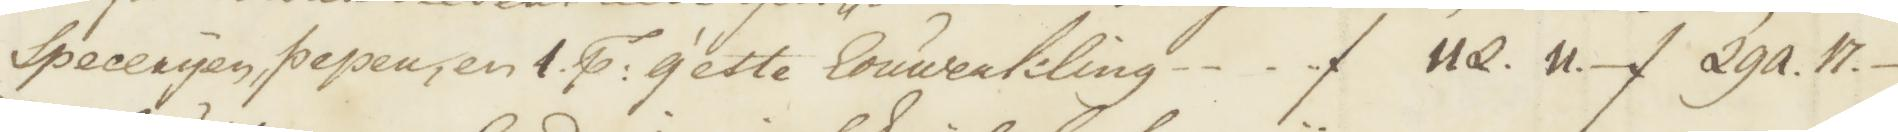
specerijen, peper, en 1. p:s g'este houwerkling - - - - ƒ 112. 11. — ƒ 294. 17. —
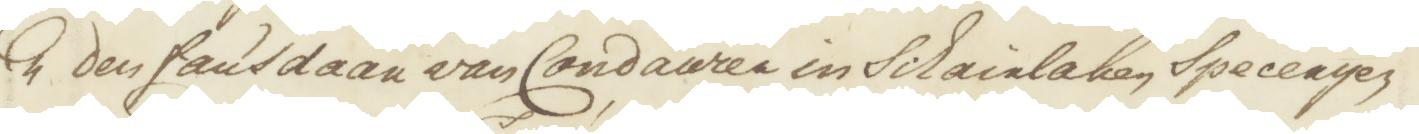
den faus daar van Condaaren in schairlaken specerijen
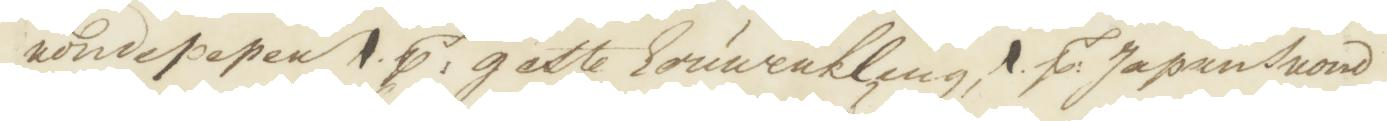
ronde peper 1. p:s g'este houwerkling, 1. p:s Japans rond
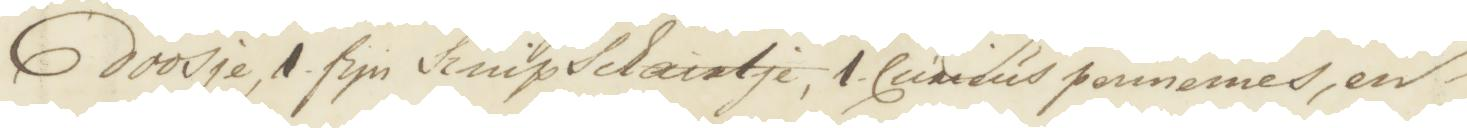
doosje, 1. fijn knipschairtje, 1. Curicus pennemes, en
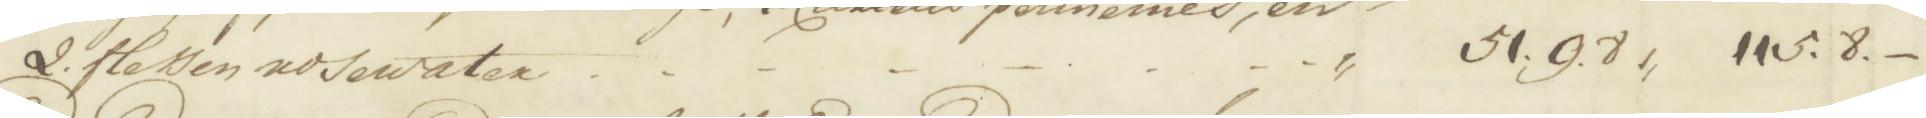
2. flessen rosewater - - - - - . - - - „ 51. 9. 8 „ 115. 8. —
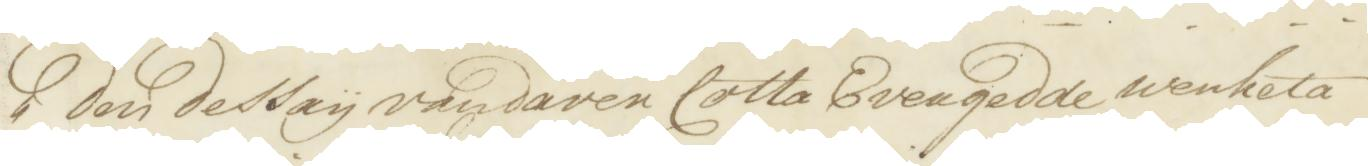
„ den dessaij van daver Cotta Evergedde wenketa
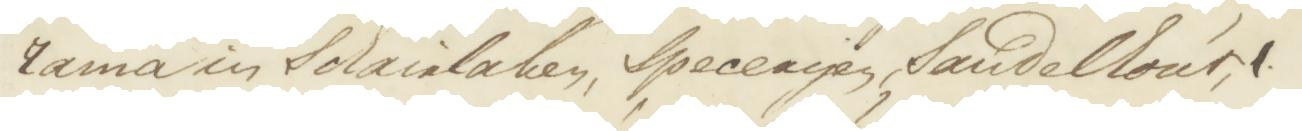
rama in schairlaken, specerijen, sandelhout, 1.
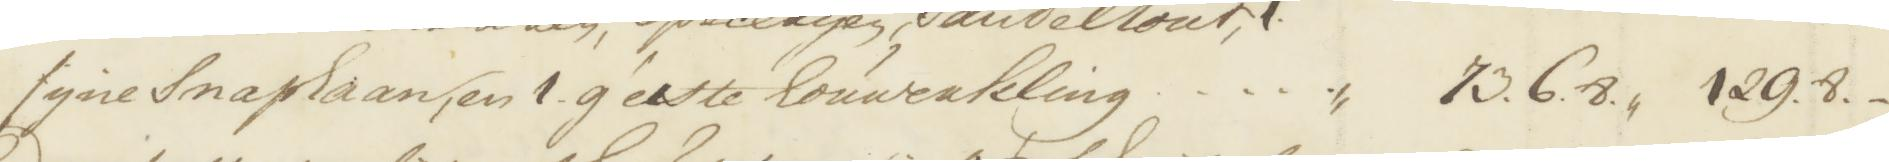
fijne snaphaan, en 1. g'eiste houwerkling . . . . . „ 73. 6. 8. „ 129. 8. —
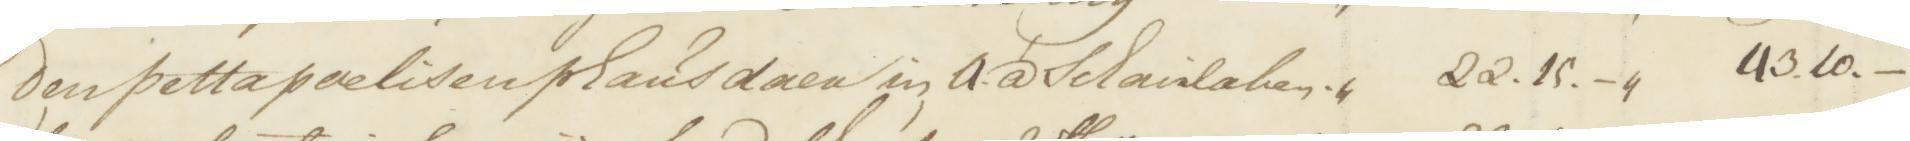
den pettapoelisen phaus daer in 4. á schairlaken . „ 22. 15. — „ 43. 10. —
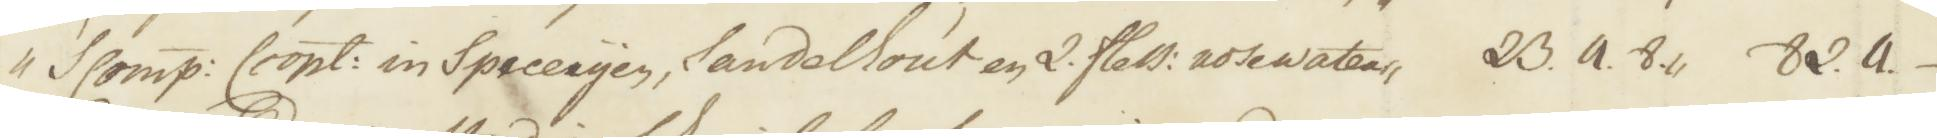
„ 's Comp: Coopl: in specerijen, sandelhout en 2. fless: rosewater „ 23. 4. 8. „ 82. 4. —
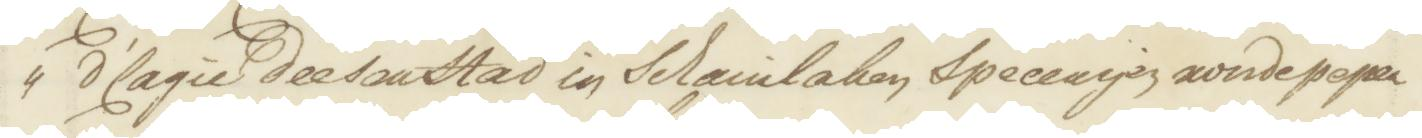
„ d'Cagie deeser stad in schairlaken specerijen ronde peper
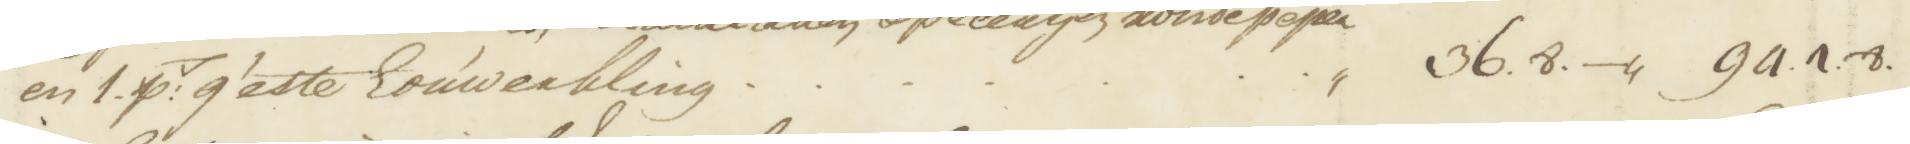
en 1. p:s g'este houwerkling . . . . . . . „ 36. 8. — „ 94. 1. 8.
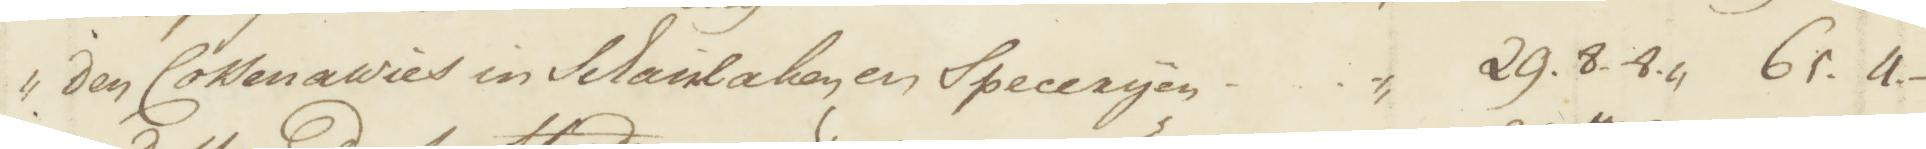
„ den Cossenawies in schairlaken en specerijen . . . . „ 29. 8. 8. „ 65. 4.
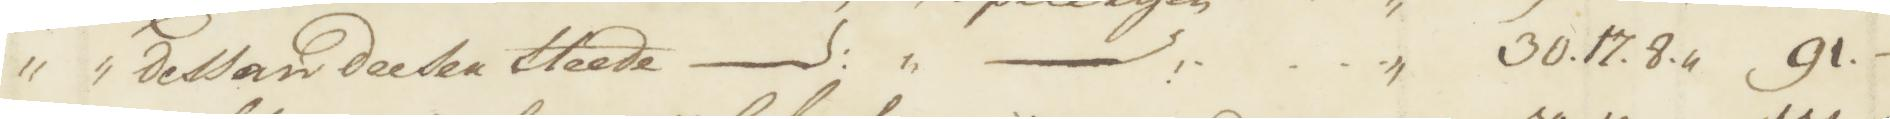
„ „ dessan deeser steede _:o „ _:o . . . . „ 30. 17. 8. „ 91.
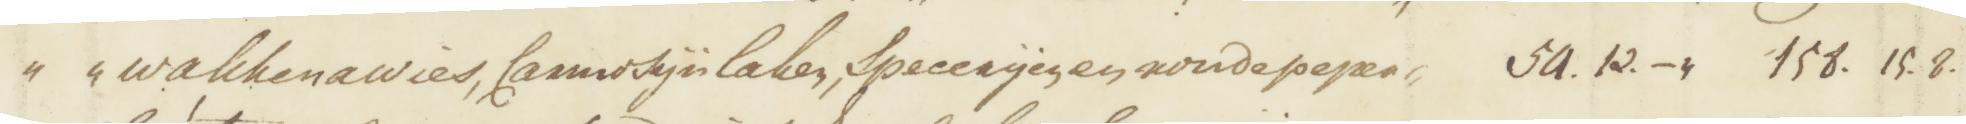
„ „ wakkenawies, Carmosijn laken, specerijen en ronde peper „ 54. 12. — „ 158. 15. 8.
